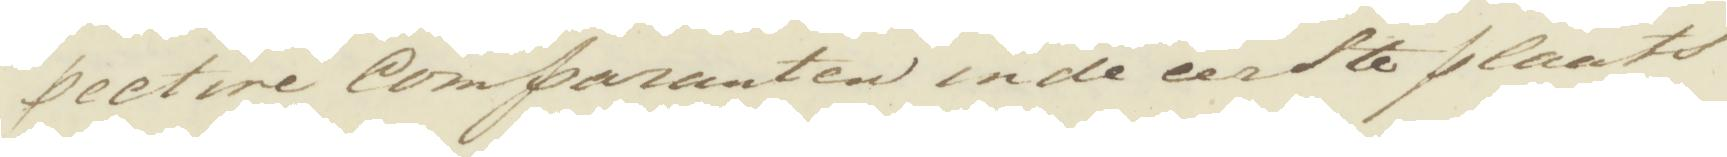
pective Comparanten in de eerste plaats
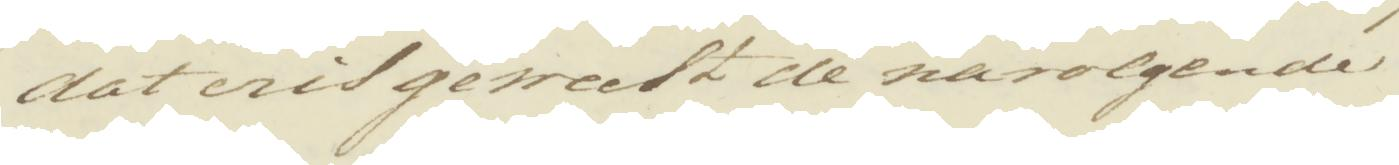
dat er is geweest de navolgende
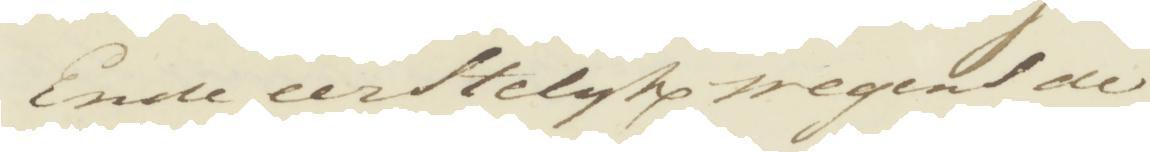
Ende eerstelyk wegens de
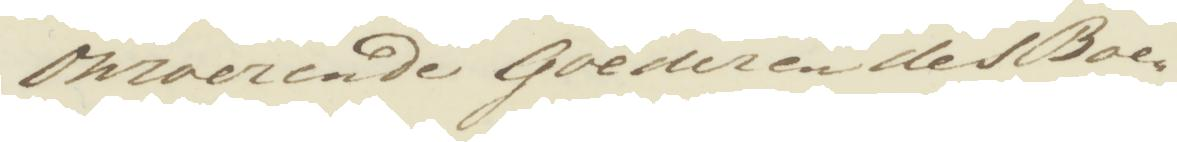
onroerende Goederen des Boe
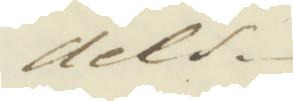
dels.
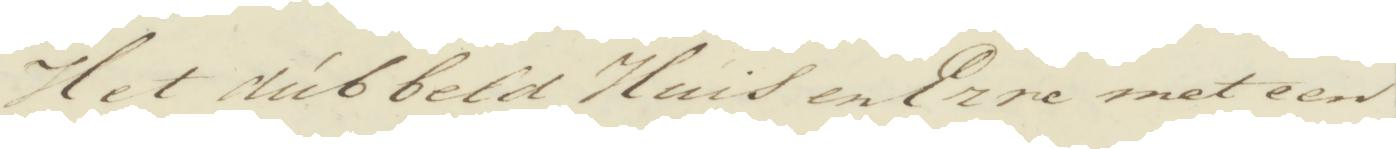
Het dubbeld Huis en Erve met een
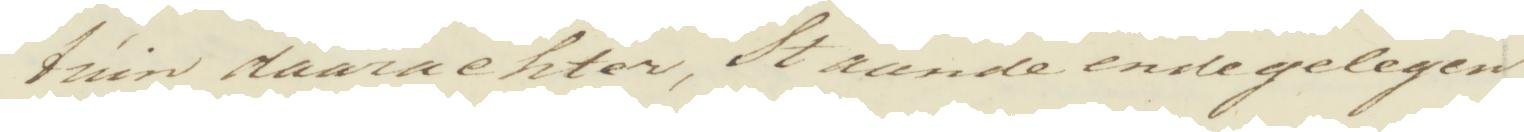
tuin daarachter, staande ende gelegen
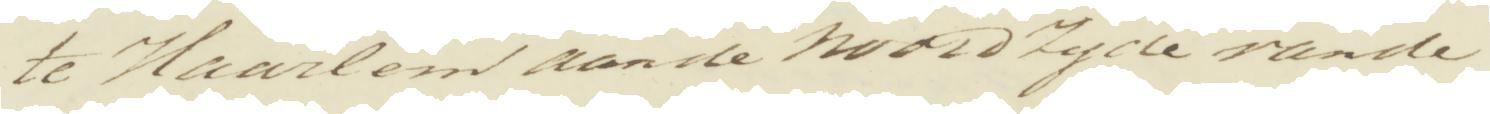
te Haarlem aan de noordzyde vande
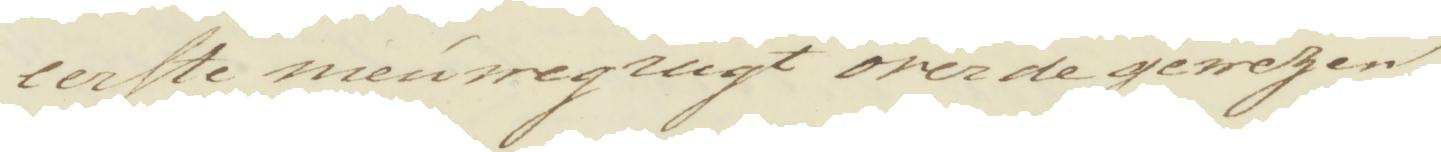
eerste nieuwegragt over de gewezen
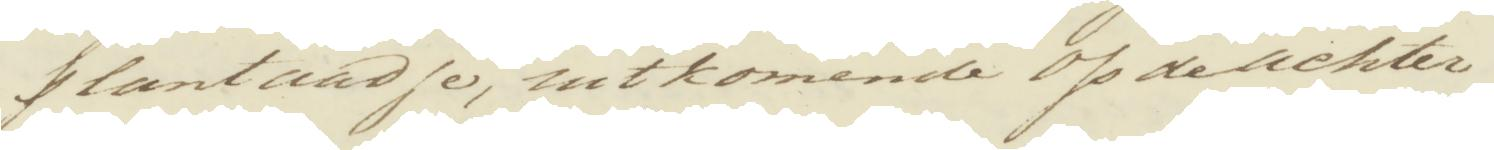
plantaadje, uitkomende op de achter
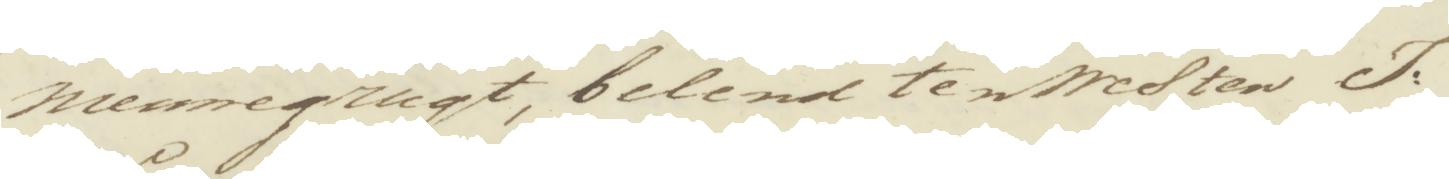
nieuwegragt, belend ten westen I:
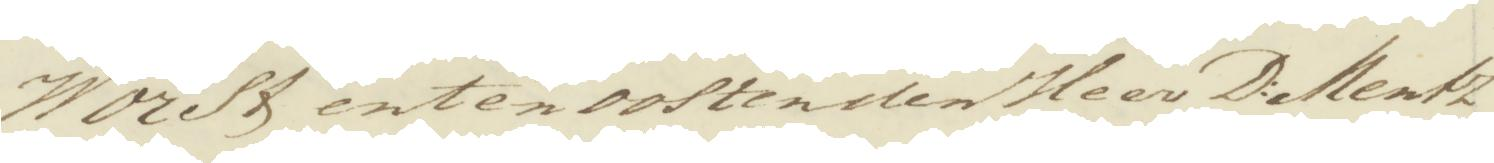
Worst en ten oostenden Heer D: Mentz
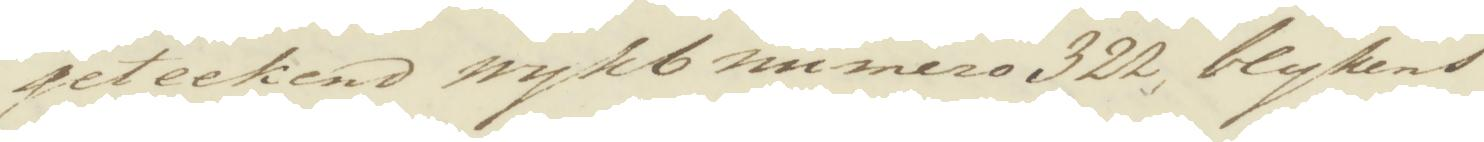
geteekend wyk 6 numero 322, blykens
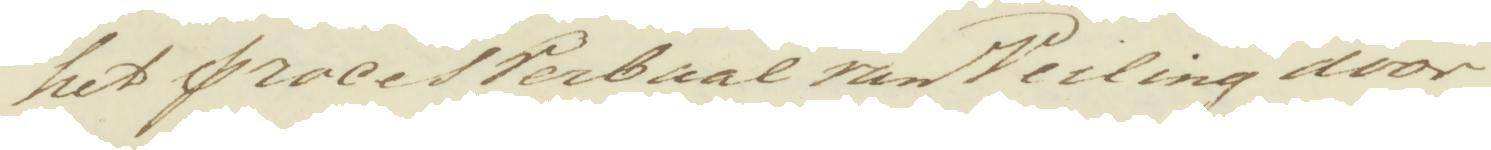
het proces verbaal van Veiling door
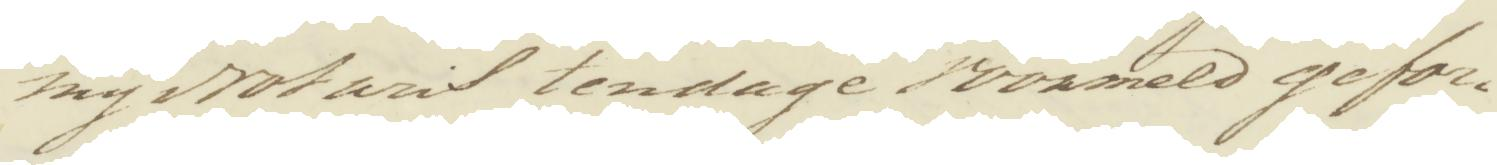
my Notaris ten dage voormeld gefor
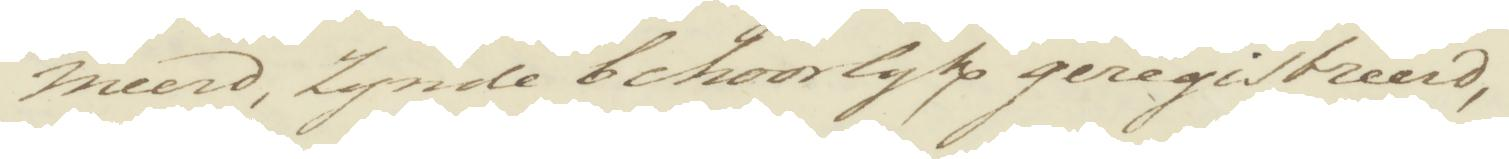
meerd, zynde behoorlyk geregistreerd,
